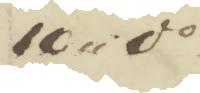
10 „ do
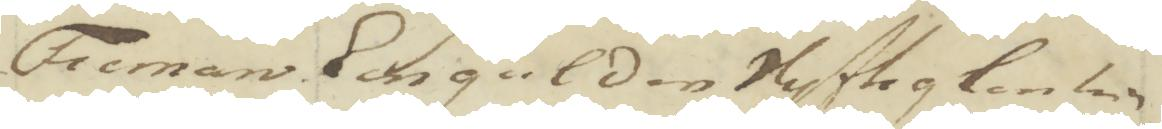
Fieman Een gulden Vijftig Cents
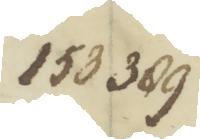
153 389
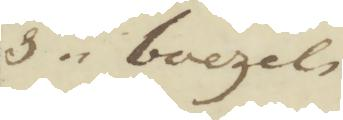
3 „ boezels
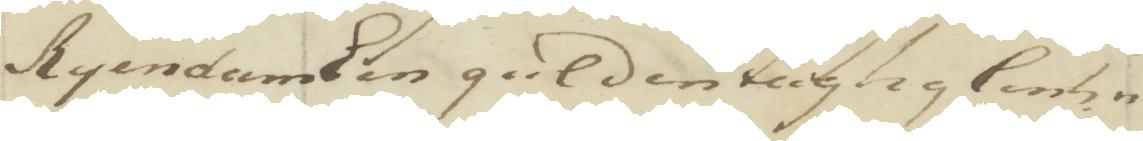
Ryendam Een gulden tagtig Cents
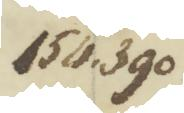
154. 390
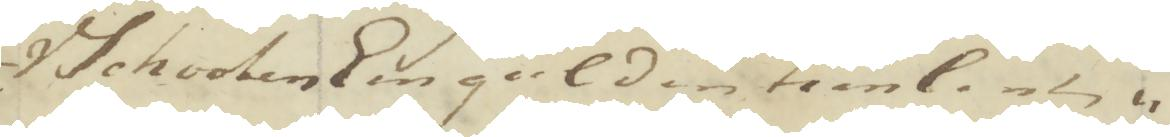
V Schooten Een gulden tien Cents „
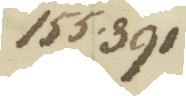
155.391
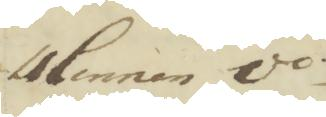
4 binnen do
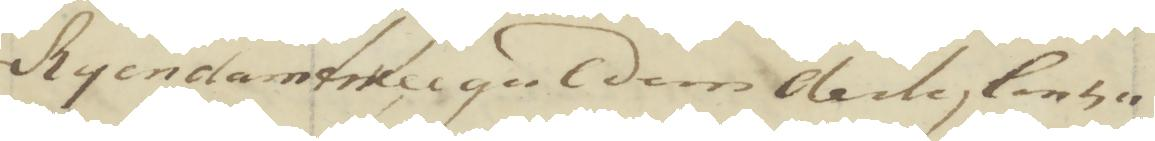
Ryendam twee guldens dertig Cents
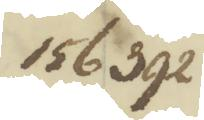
156 392
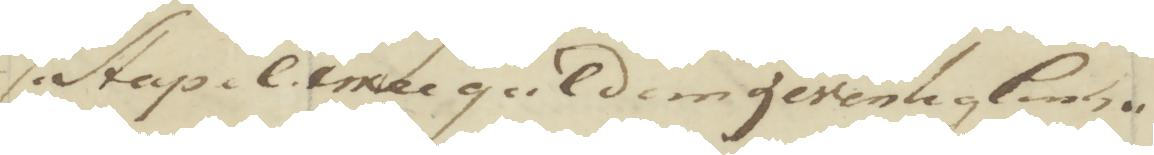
J. Stapel twee gulden zeventig Cents„
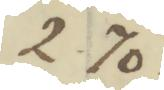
2. 70
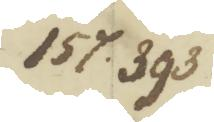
157. 393
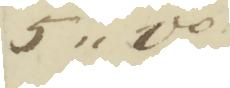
5 „ do
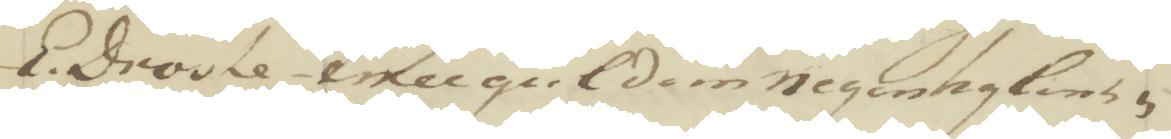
E. Droste - twee guldens negentig Cents „
